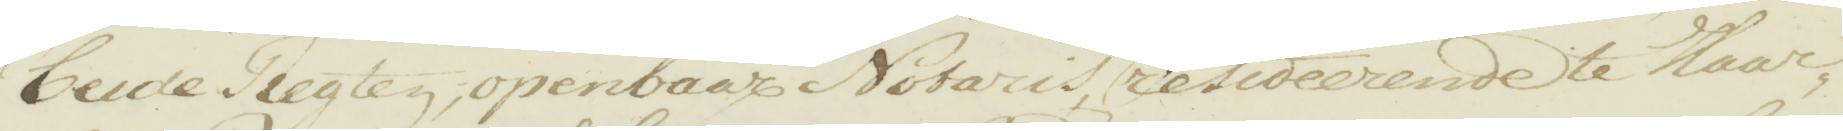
beide Regten, openbaar Notaris, resideerende te Haar„
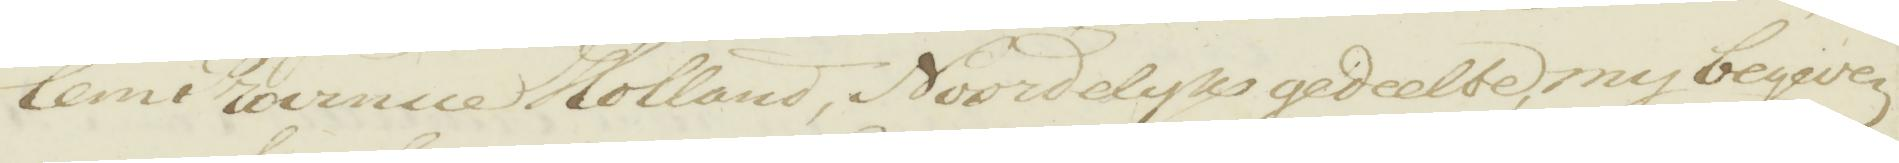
lem Provincie Holland, Noordelyks gedeelte, my begeven
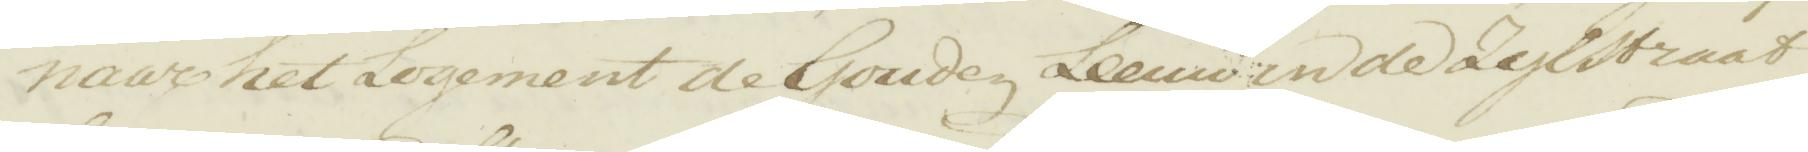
naar het Logement de Gouden Leeuw in de Zylstraat
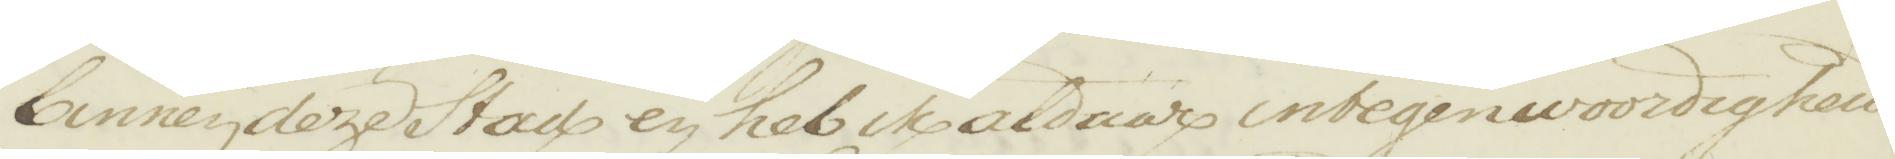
binnen deze stad en heb ik aldaar integenwoordigheid
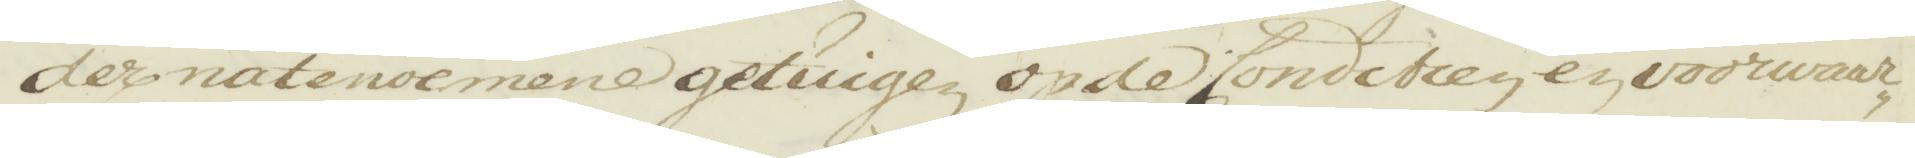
der natenoemene getuigen op de Conditien en voorwaar„
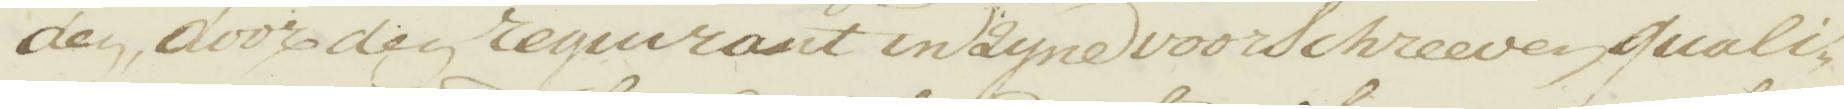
den, door den requirant in zyne voorschreeven quali„
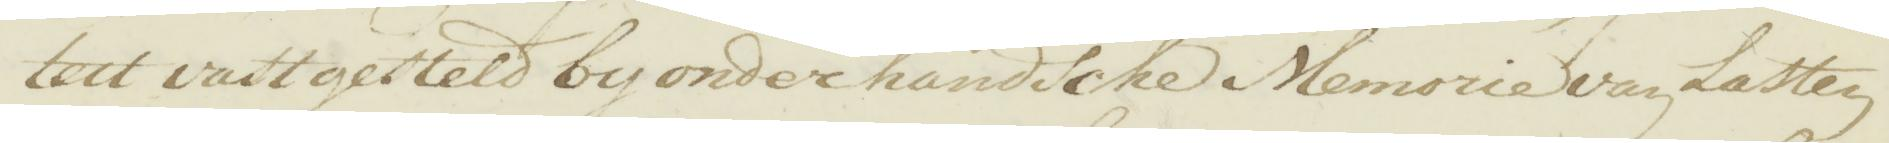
teit vastgesteld by onderhandsche Memorie van Lasten
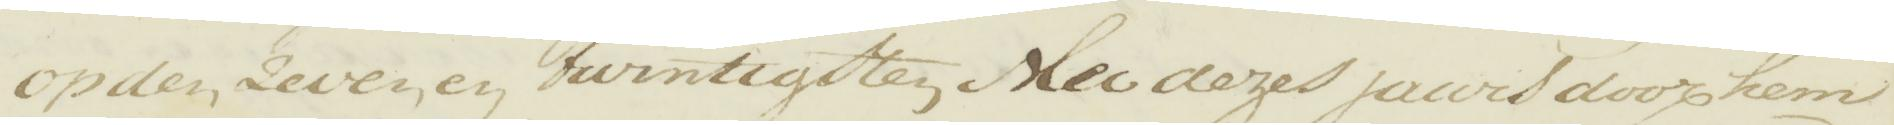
op den zeven en twintigsten Mei dezes jaars door hem
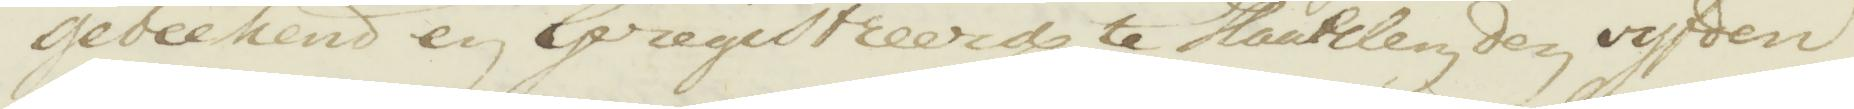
geteekend en Geregistreerd te Haarlem den vyfden
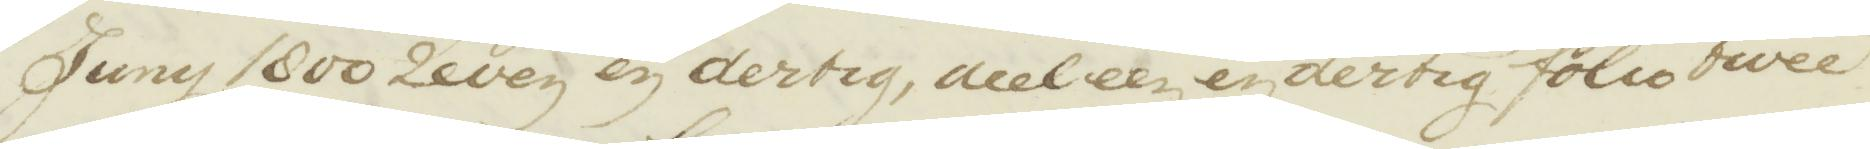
Juny 1800 zeven en dertig, deel een en dertig folio twee
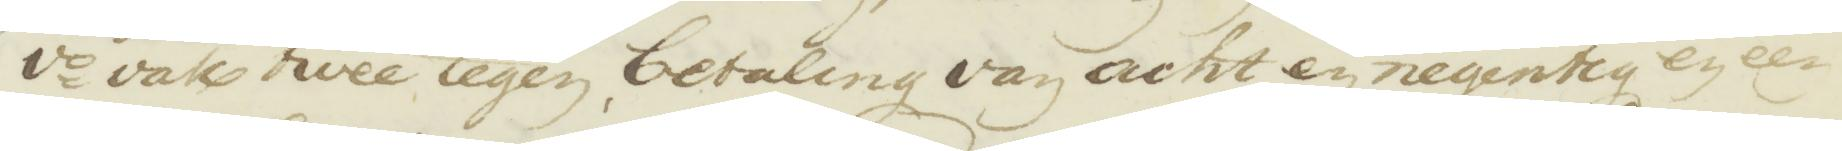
V=o vak twee tegen betaling van acht en negentig en een
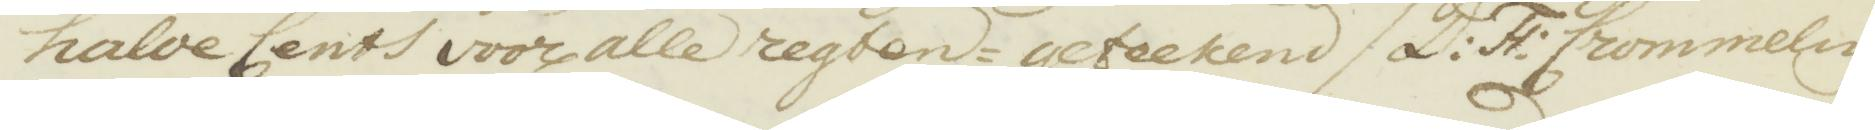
halve Cents voor alle regten = geteekend / D: F: Crommelin
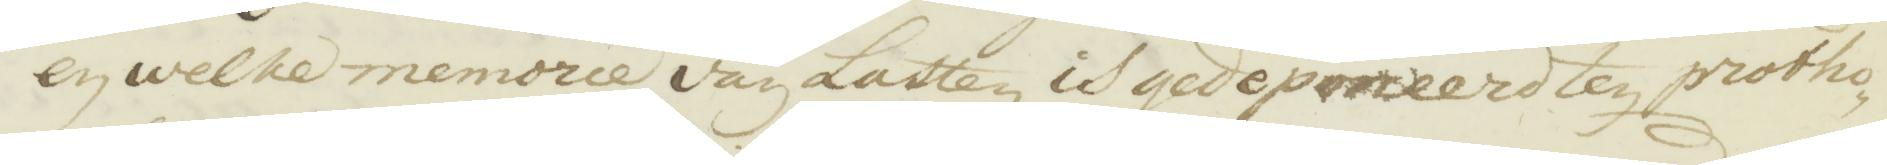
en welke memorie van Lasten is gedeponeerd ten protho„
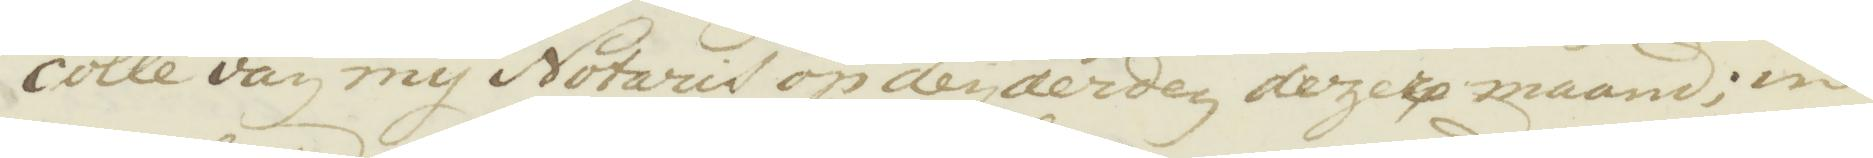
colle van my Notaris op den derden dezer maand, in
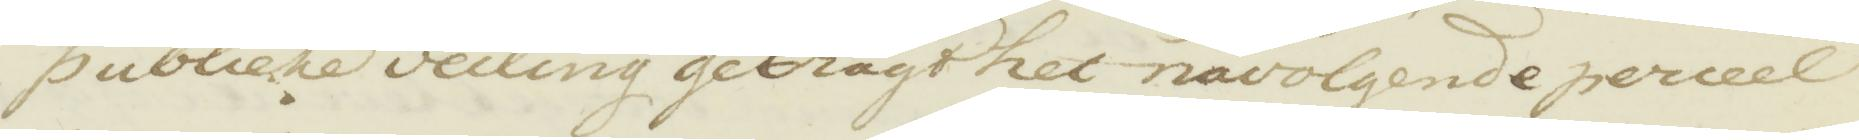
publieke veiling gebragt het navolgende perceel
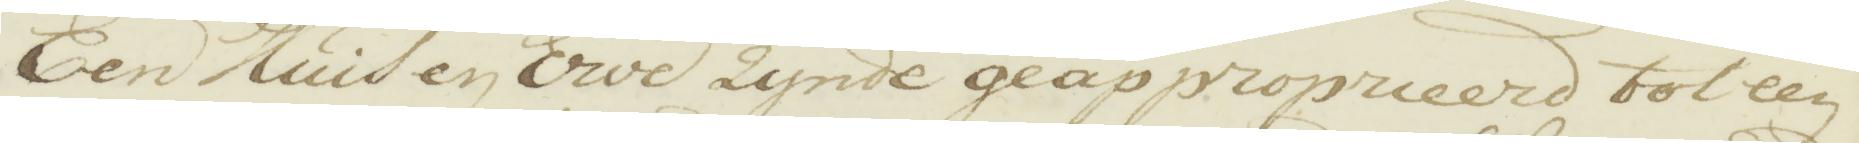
Een Huis en Erve zynde geapproprieerd tot een
